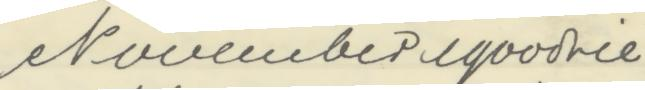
November 1900drie
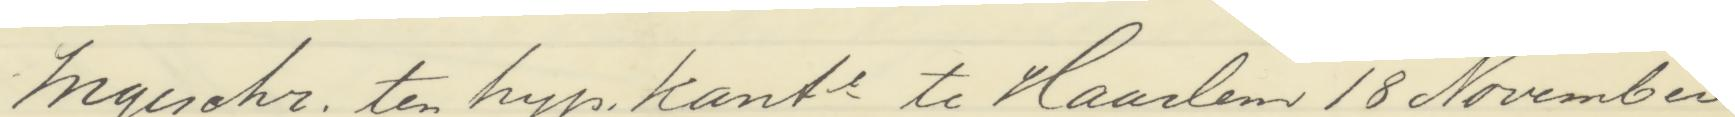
Ingeschr. ten hyp.kant-r te Haarlem 18 November
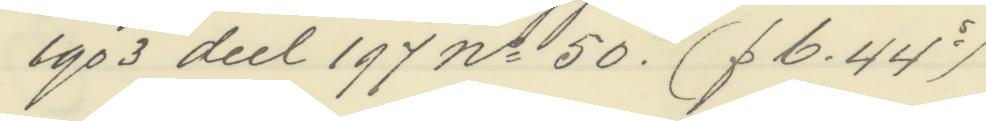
1903 deel 197 n=o 50. ( ƒ 6.44=5)
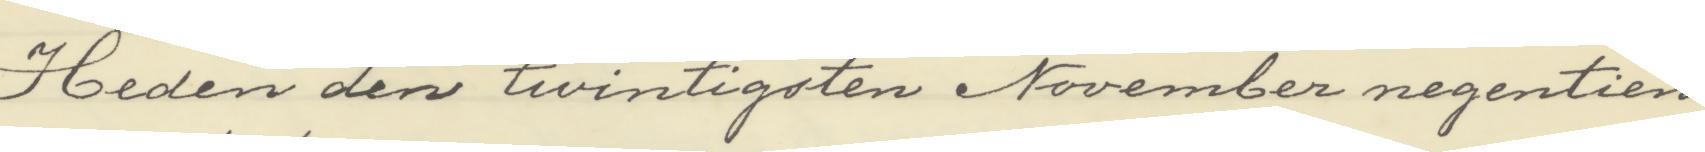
Heden den twintigsten November negentien
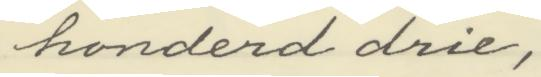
honderd drie,
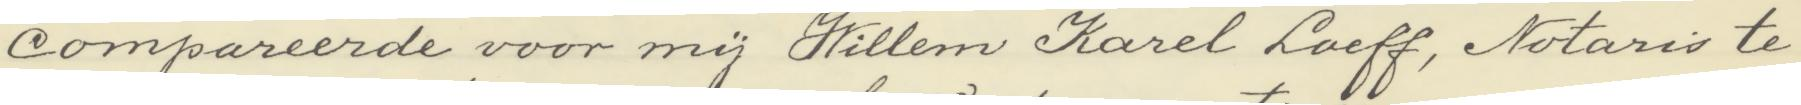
Compareerde voor mij Willem Karel Loeff, Notaris te
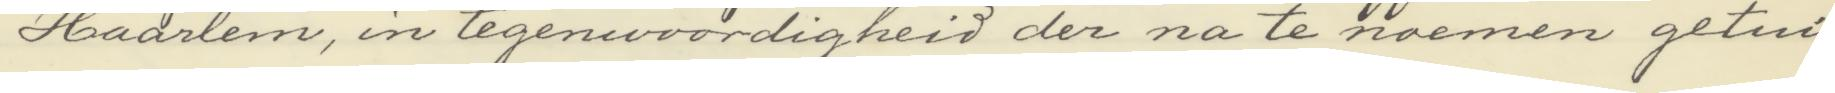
Haarlem, in tegenwoordigheid der na te noemen getui
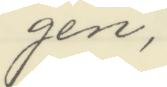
gen,
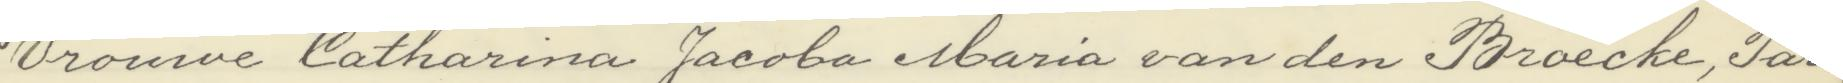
Vrouwe Catharina Jacoba Maria van den Broecke, Par=
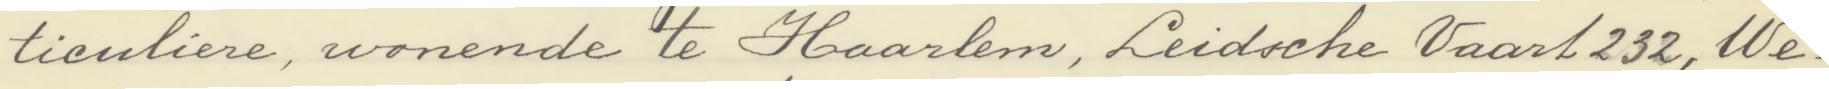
ticuliere, wonende te Haarlem, Leidsche Vaart 232, We
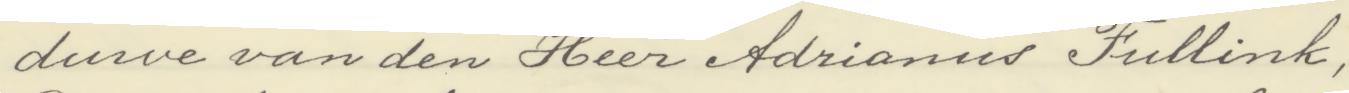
duwe van den Heer Adrianus Fullink,
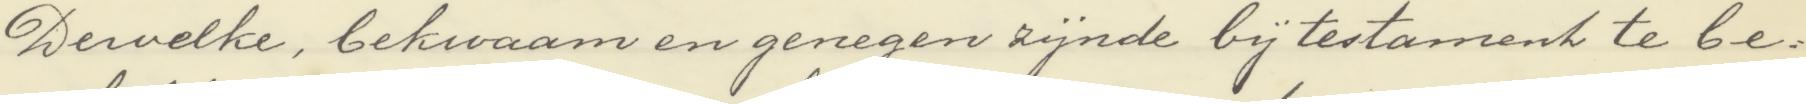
Dewelke, bekwaam en genegen zijnde bij testament te be=
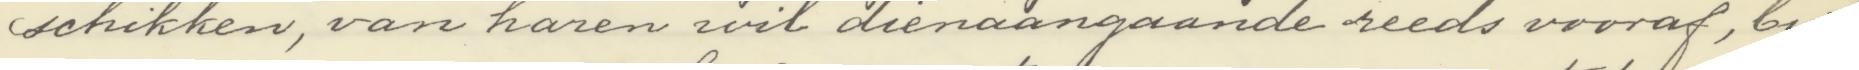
schikken, van haren wil dienaangaande reeds vooraf, bui=
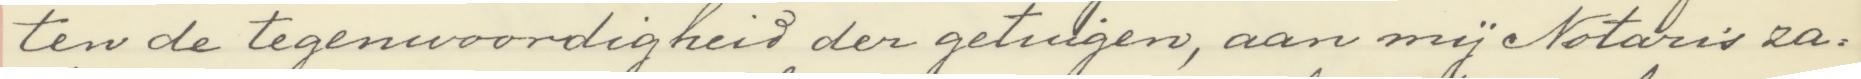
ten de tegenwoordigheid der getuigen, aan mij Notaris za=
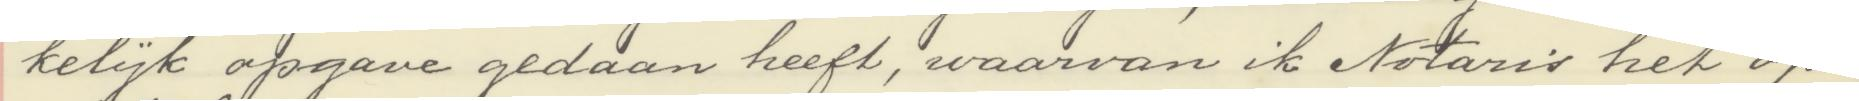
kelijk opgave gedaan heeft, waarvan ik Notaris het op=
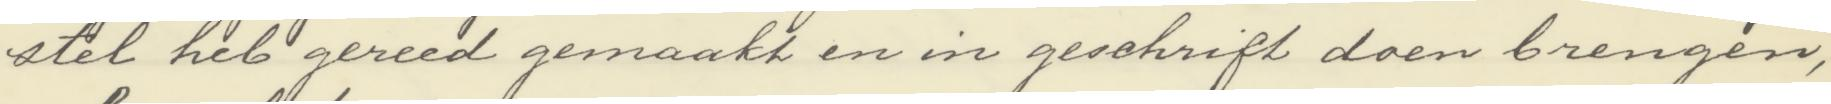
stel heb gereed gemaakt en in geschrift doen brengen,
